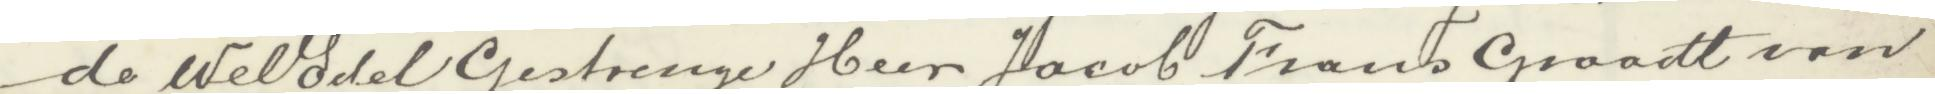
de Wel Edel Gestrenge Heer Jacob Frans Graadt van
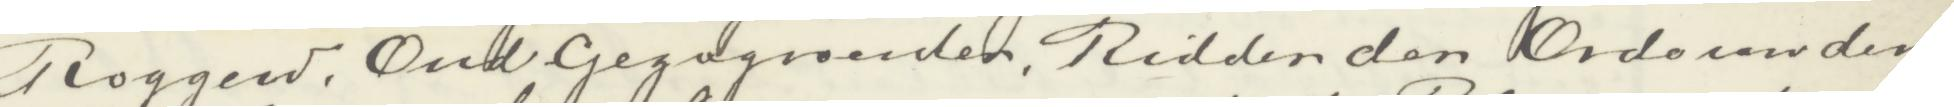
Roggen, Oud Gezagvoerder, Ridder der Orde van den
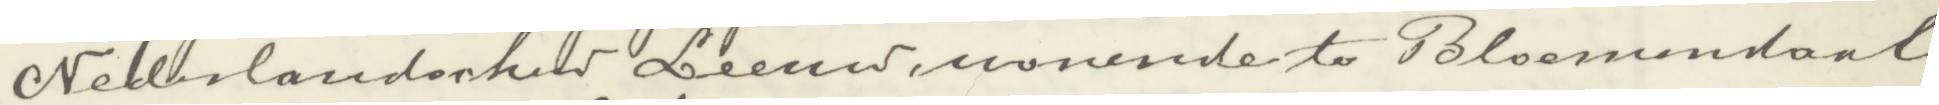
Nederlandschen Leeuw, wonende te Bloemendaal
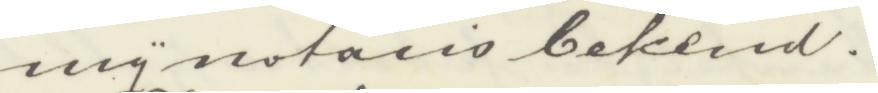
mij notaris bekend.
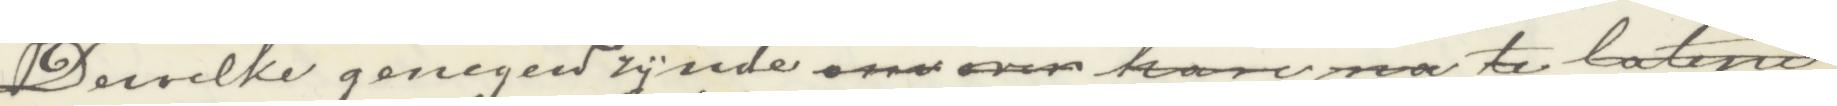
Dewelke genegen zijnde om over hare na te latene
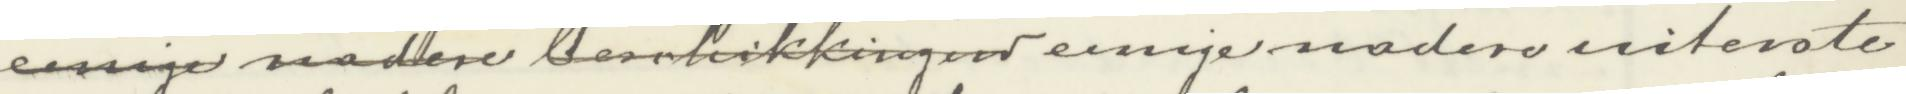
eenige nadere beschikkingen eenige nadere uiterste
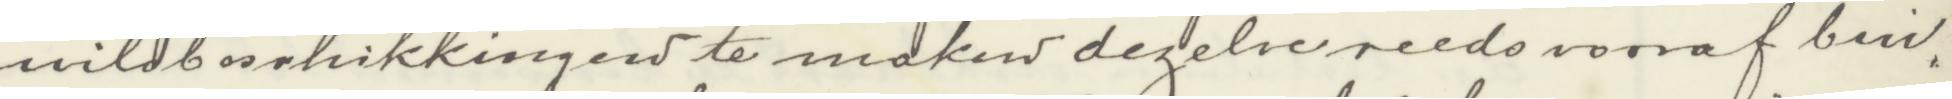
wilsbeschikkingen te maken dezelve reeds vooraf bui„
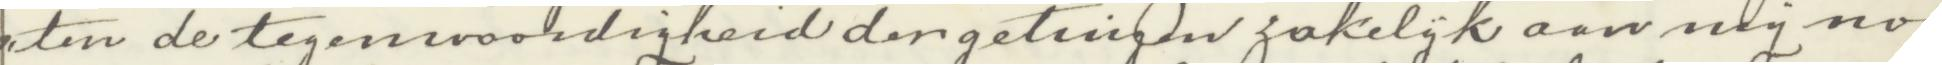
„ten de tegenwoordigheid der getuigen zakelijk aan mij no
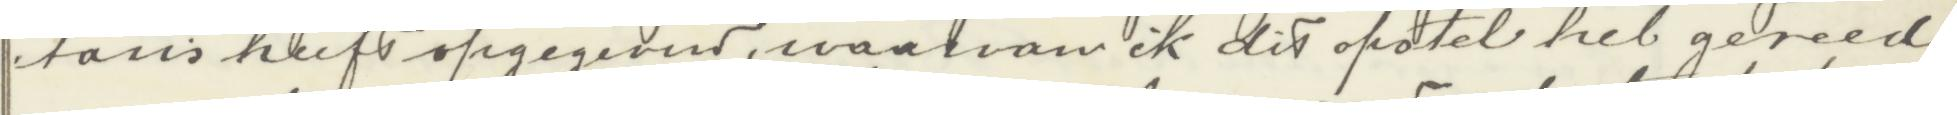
„taris heeft opgegeven, waarvan ik dit opstel heb gereed
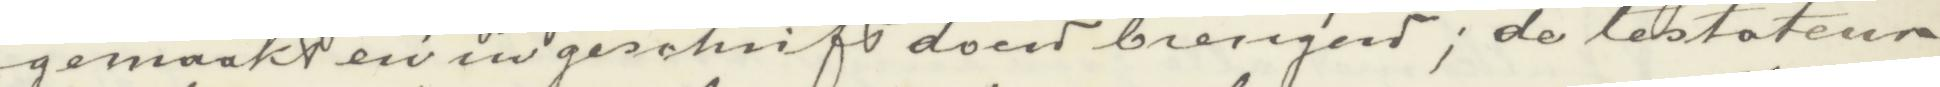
gemaakt en in geschrift doen brengen; de testateur
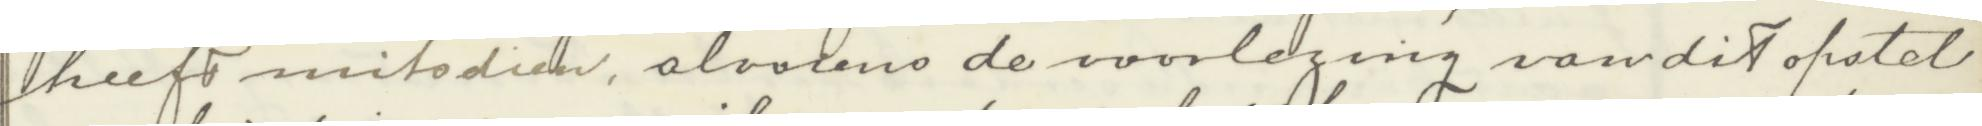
heeft mitsdien, alvorens de voorlezing van dit opstel
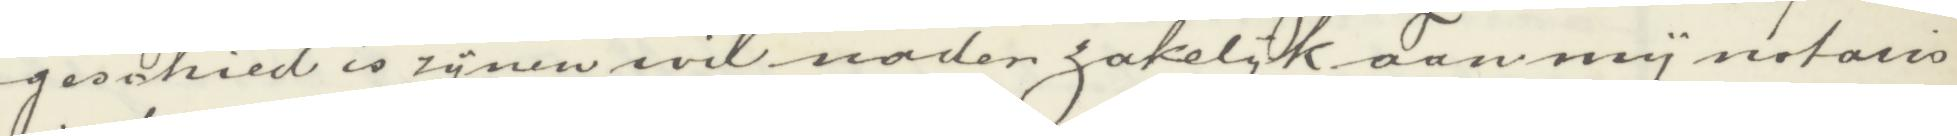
geschied is zijnen wil nader zakelijk aan mij notaris
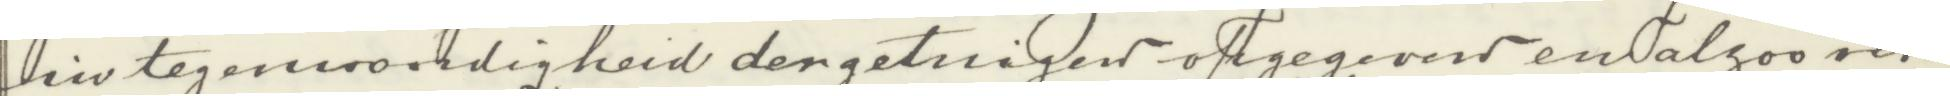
in tegenwoordigheid der getuigen opgegeven en alzoo ver
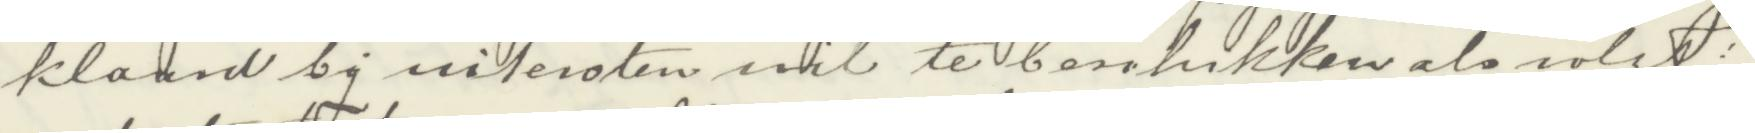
klaard bij uitersten wil te beschikken als volgt:
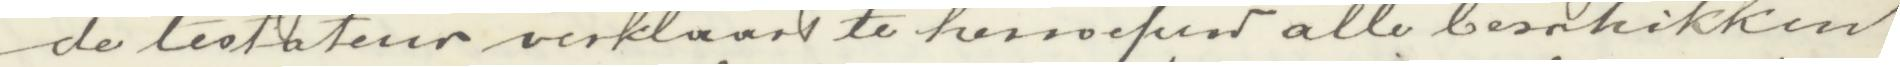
de testateur verklaard te herroepen alle beschikkin
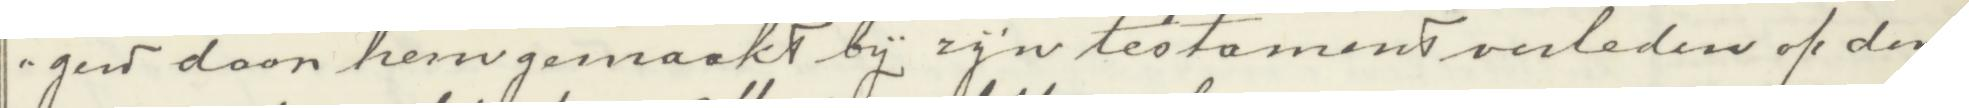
„gen door hem gemaakt bij zijn testament verleden op den
